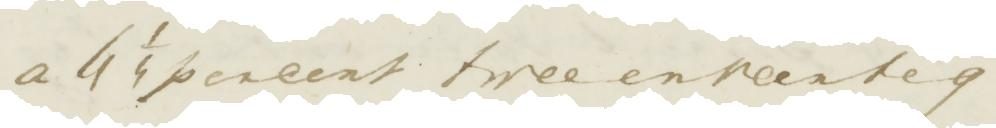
a 4¼ percent twee en veertig
